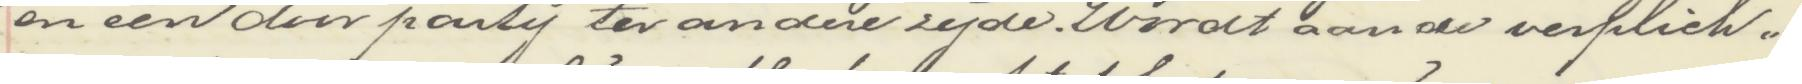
en eén door partij ter andere zijde. Wordt aan de verplich„
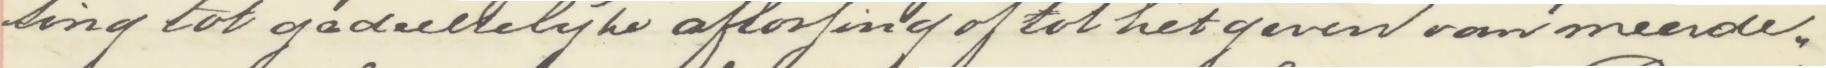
ting tot gedeeltelijke aflossing of tot het geven van meerde„
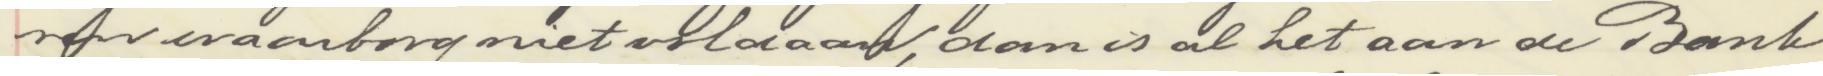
ren waarborg niet voldaan, dan is al het aan de Bank
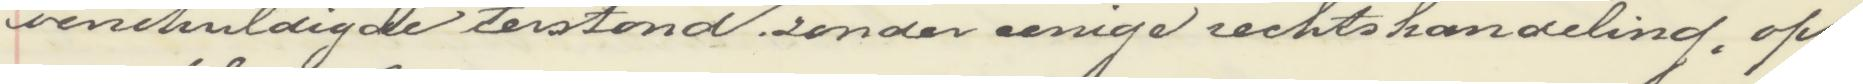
verschuldigde terstond, zonder eenige rechtshandeling, op
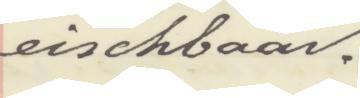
eischbaar.
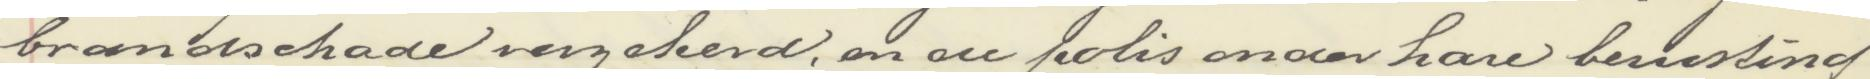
brandschade verzekerd, en de polis onder hare berusting
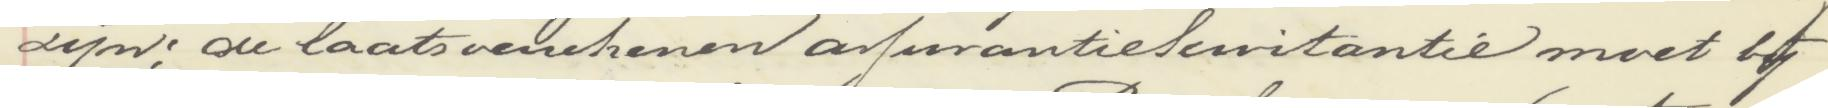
zijn: de laatsverschenen assurantiekwitantie moet bij
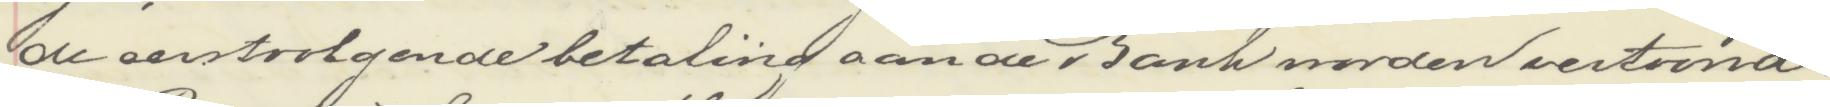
de eerstvolgende betaling aan de Bank worden vertoond
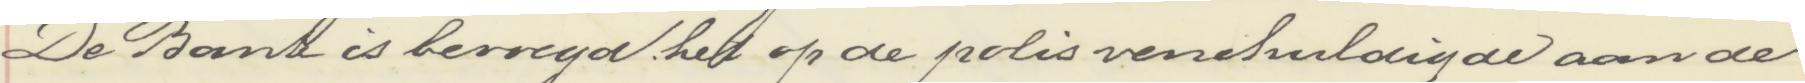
De Bank is bevoegd het op de polis verschuldigde aan de
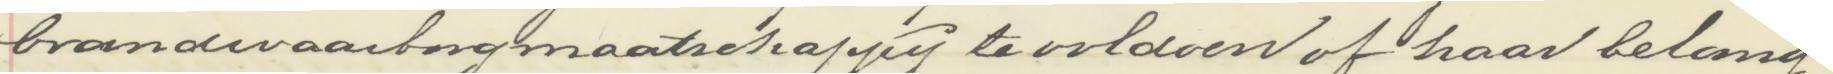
brandwaarborg maatschappij te voldoen of haar belang
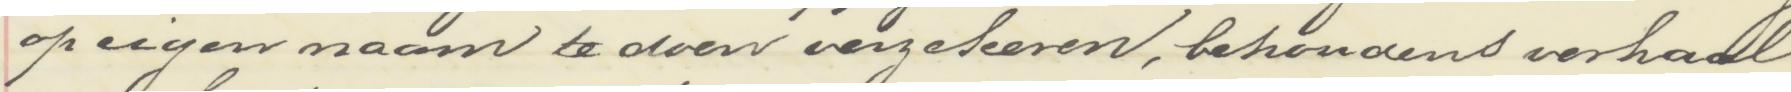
op eigen naam te doen verzekeren, behoudens verhaal
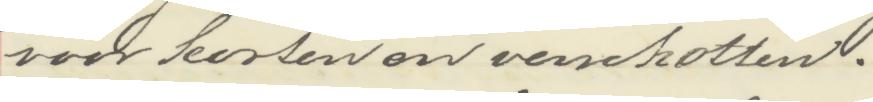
voor korten en verschotten
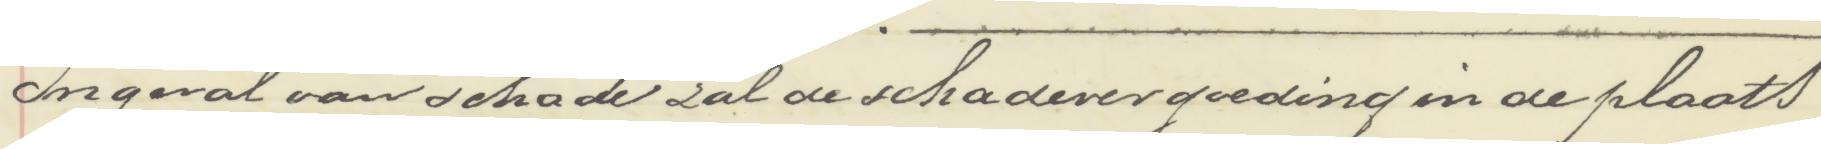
Ingeval van schade zal de schadevergoeding in de plaats
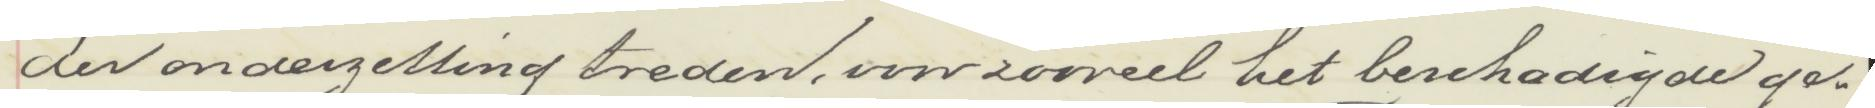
der onderzetting treden, voor zooveel het beschadigde ge„
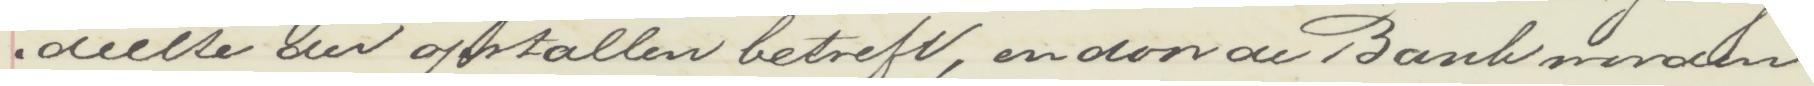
„deelte der opstallen betreft, en door de Bank worden
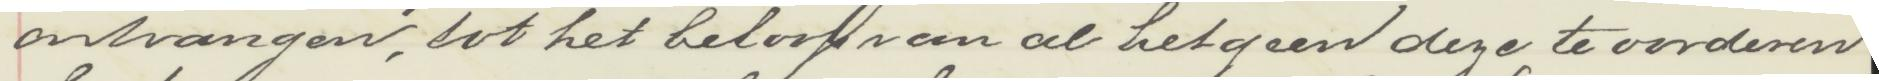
ontvangen, tot het beloop van al het geen deze te vorderen
